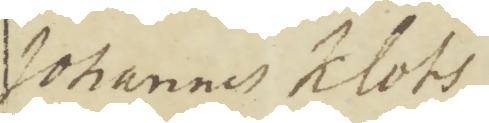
Johannes Klots.
